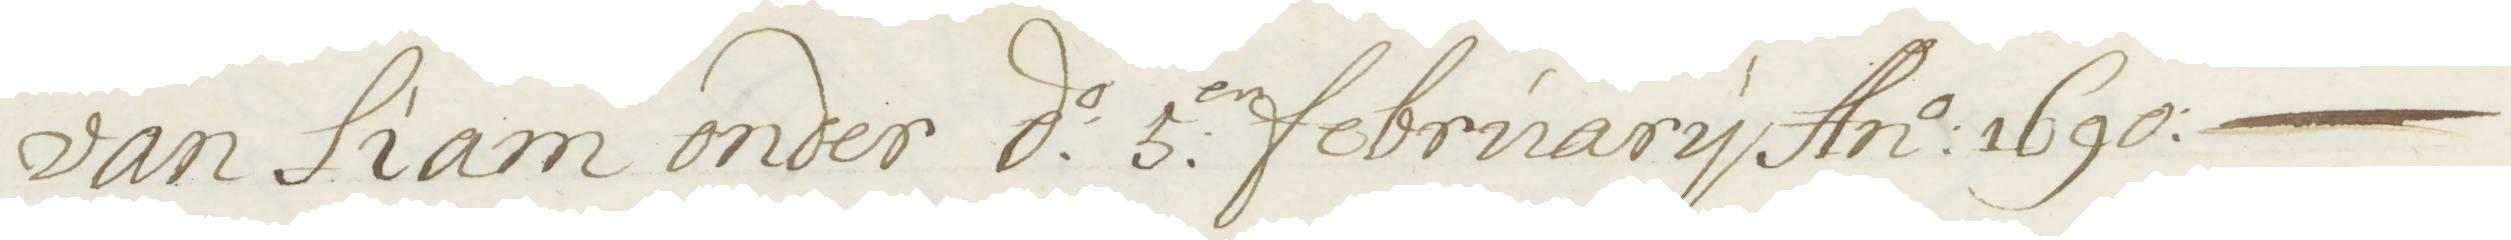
van Siam onder d:o 5:en februarij An:o 1690: —
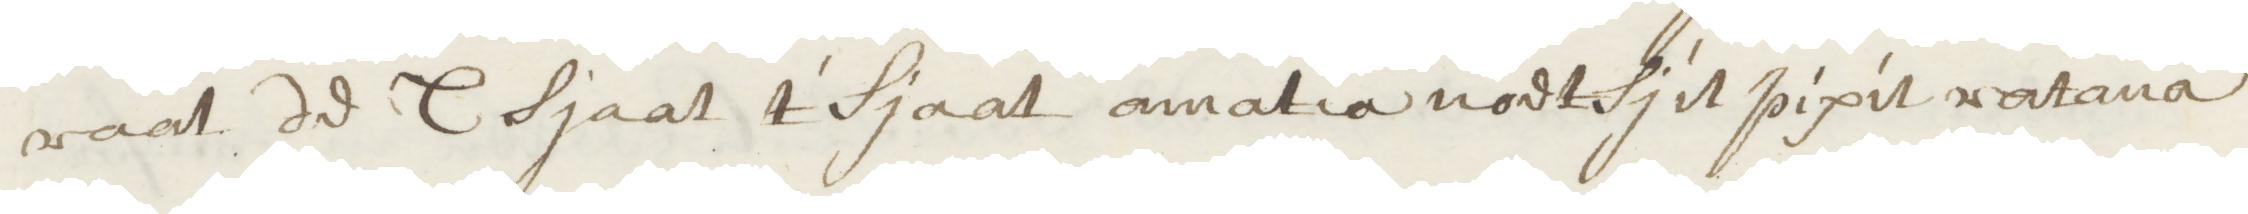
raat de Tsjaat t' sjaat amatia noetsjit pipit ratana
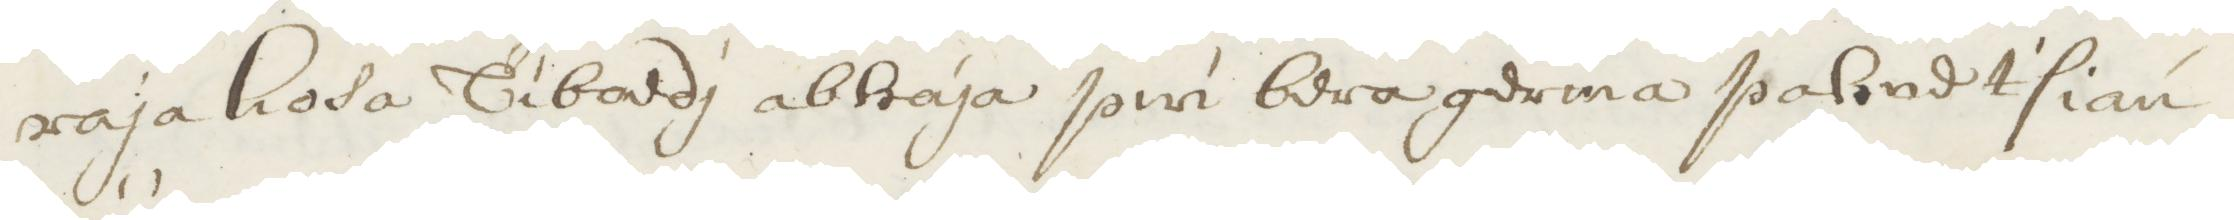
rajakosa Tiboedj abhaja piri bera germa pahne 'tsiau
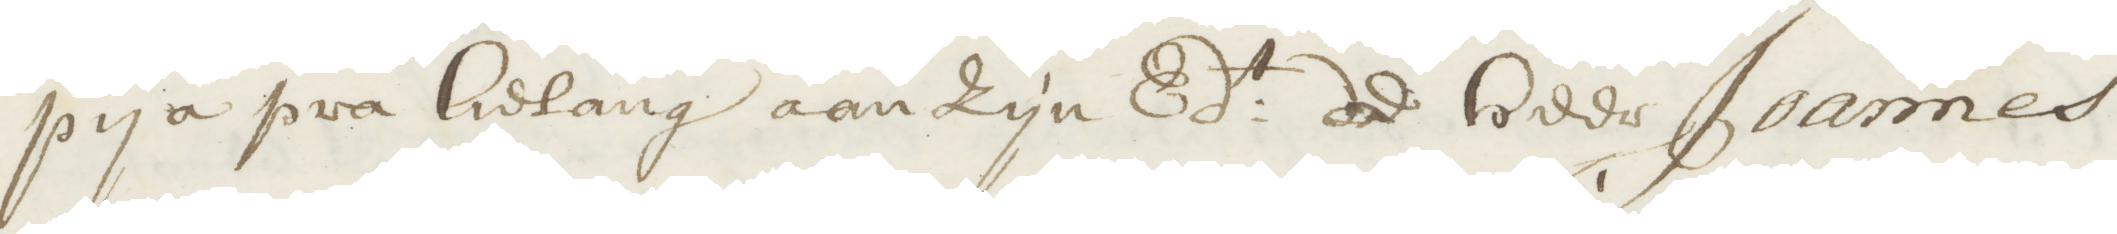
pija pra kelang aan zijn Ed:t de heer Joannes
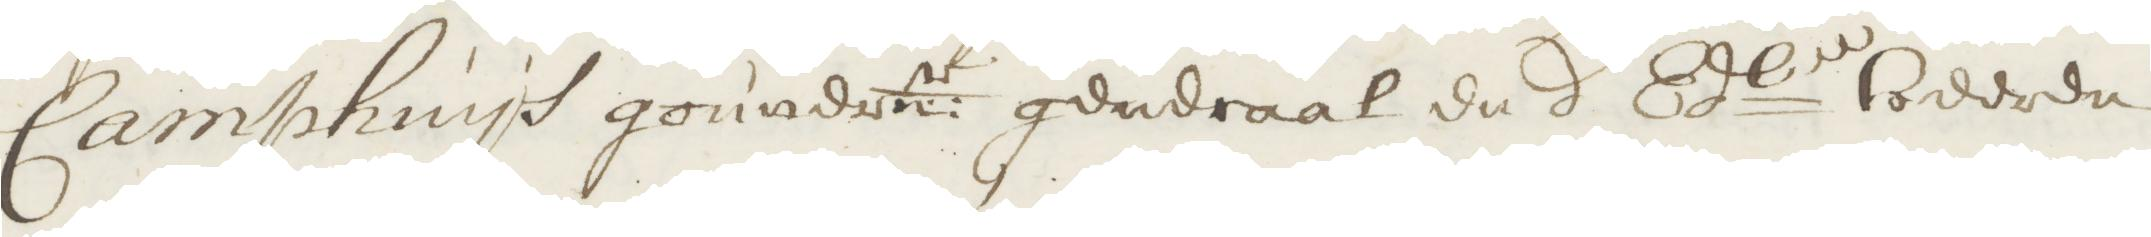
Camphuijs gouvern:r generaal en d’ Ed=le heeren
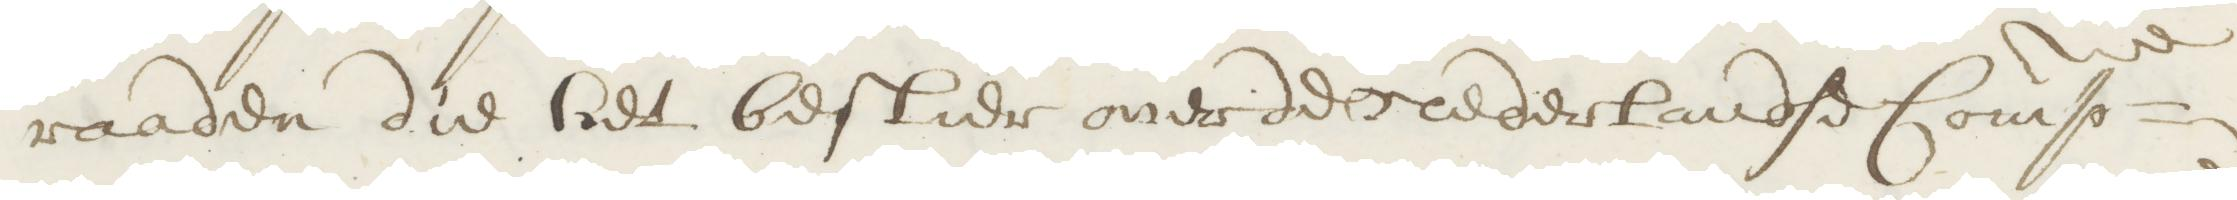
raaden die het bestier over de Nederlandse Comp=e
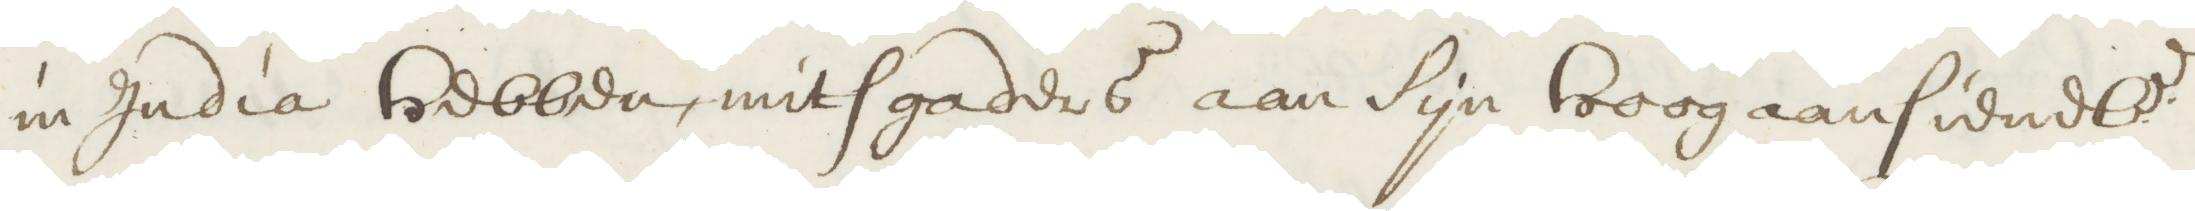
in Jndia hebben, mitsgaders aan sijn hoog aansienel:
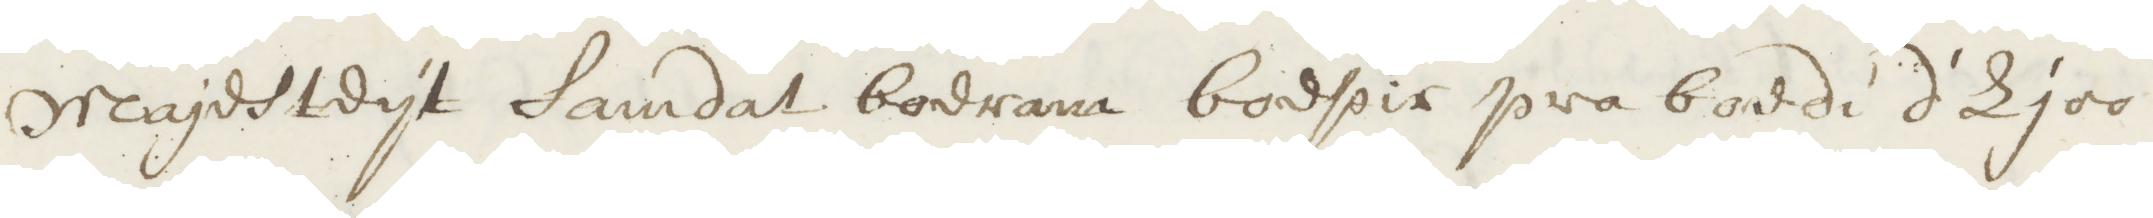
Majesteijt samdat boerana boepis pra boedi d’ zjoo
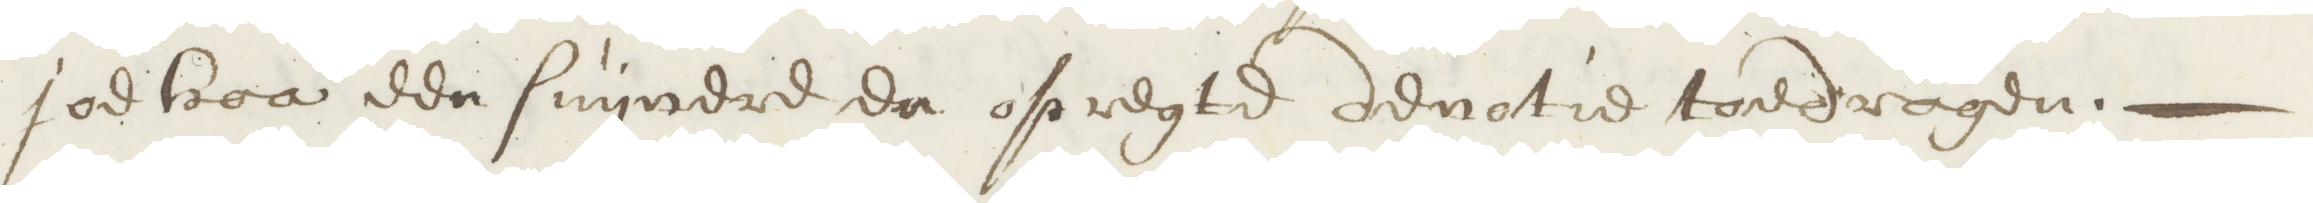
joe hoa een suijvere en opregte denotie toedragen. —
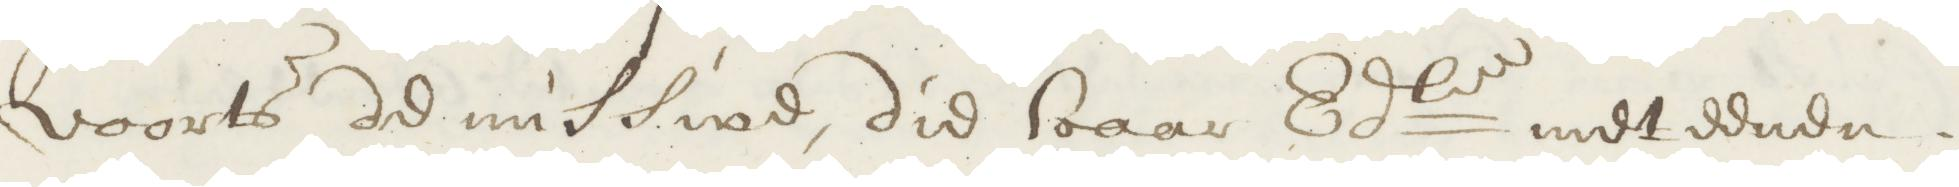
voorts de missive, die haar Ed=le met eenen
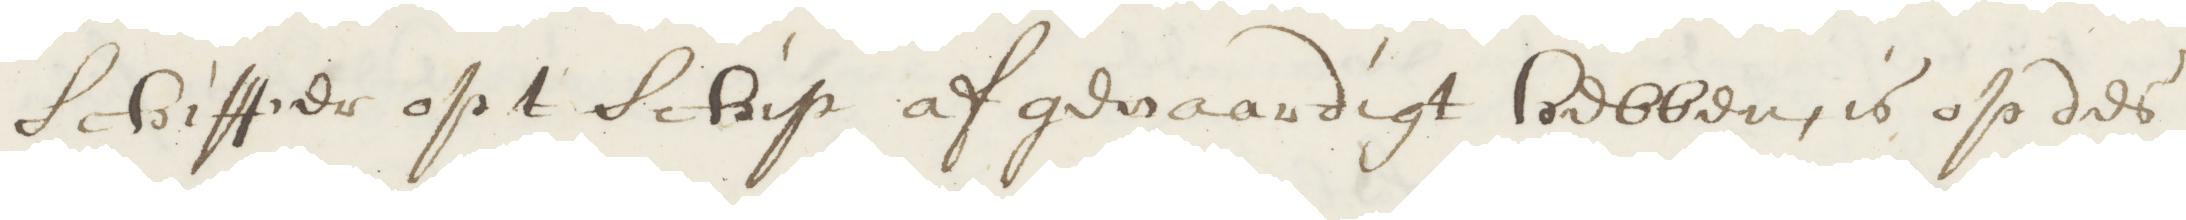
schipper op t' schip afgevaardigt hebben, is op des
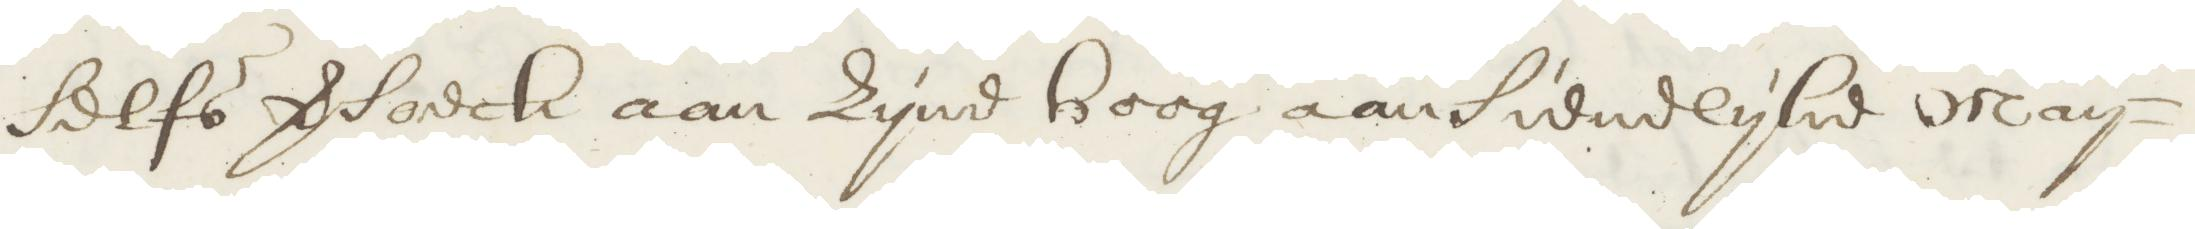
selfs versoeck aan zijne hoog aansienelijke may=t
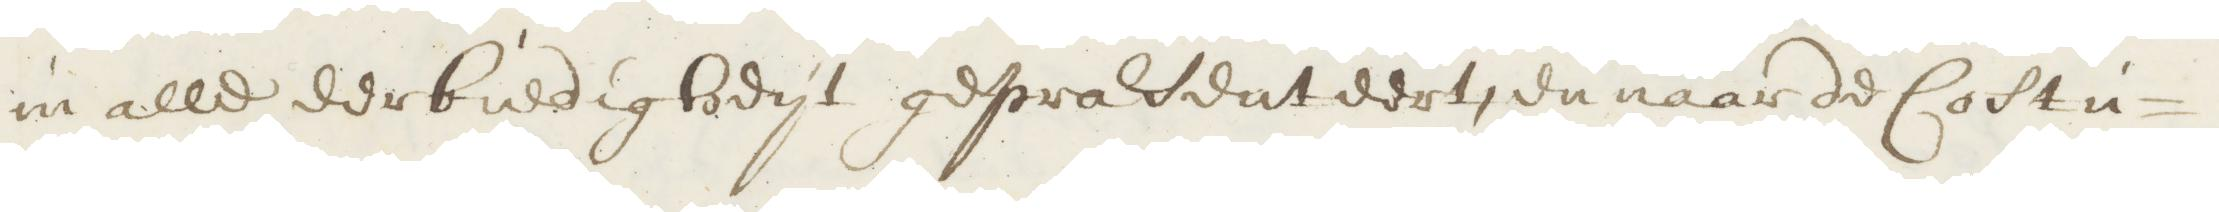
in alle eerbiedigheijt gepresenteert, en naar de Costu=
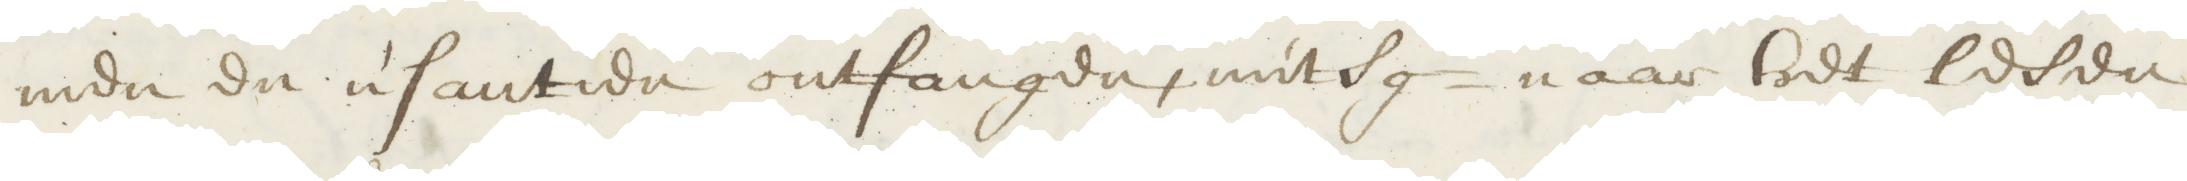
men en ufantien ontfangen, mitsg=rs naar het lesen
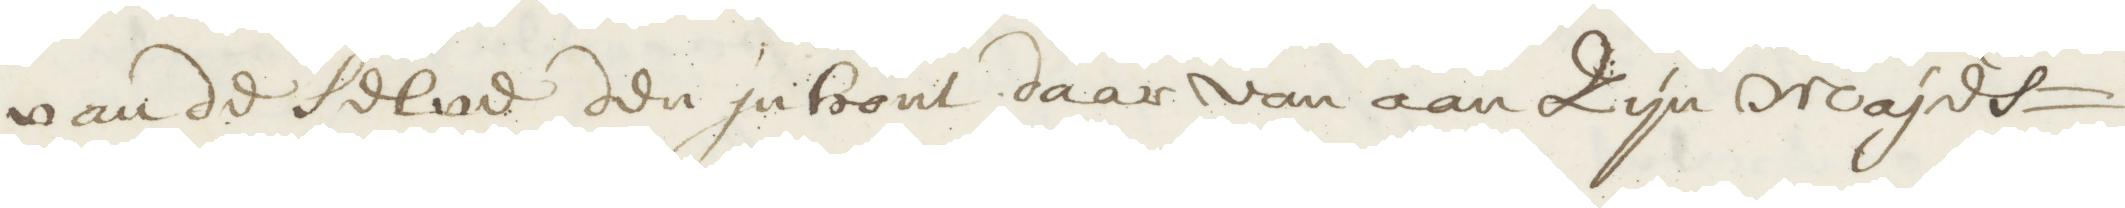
van de selve den jnhout daar van aan zijn majes=t
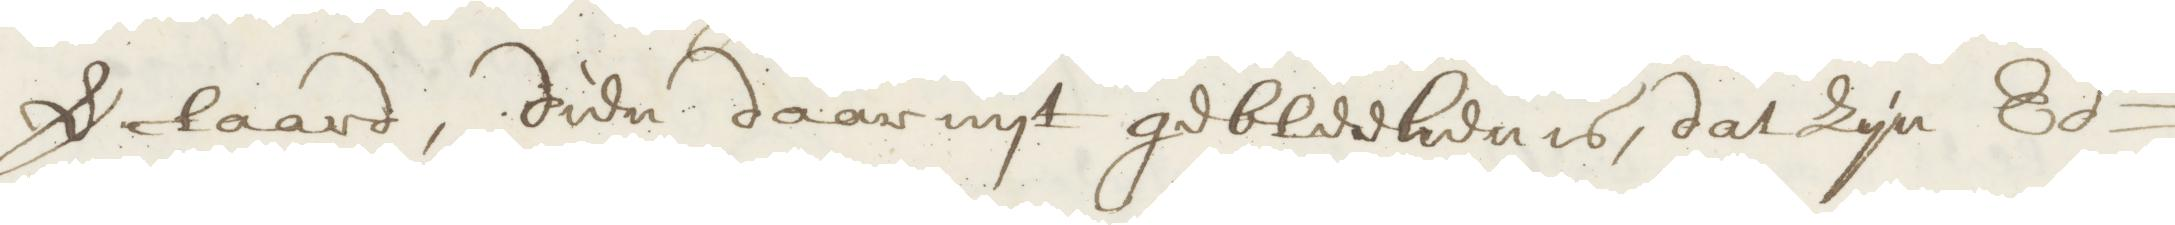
verclaard, dien daar uijt gebleeken is, dat zijn Ed=ht
